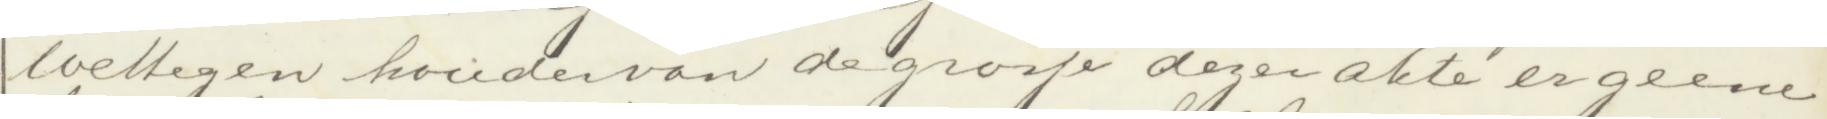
wettigen houdervan de grosse dezer akte er geene
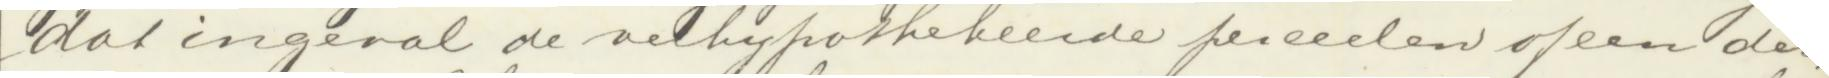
dat ingeval de verhypothekeerde perceelen of een der„
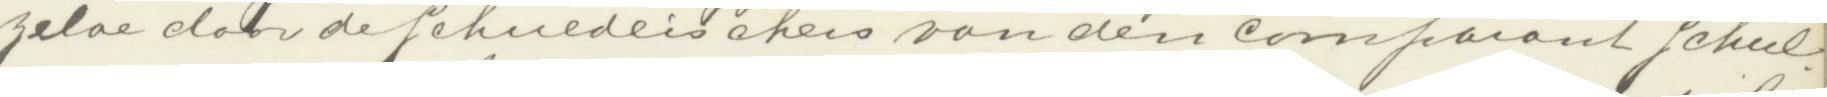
zelve door de schuldeischers van den comparant schul„
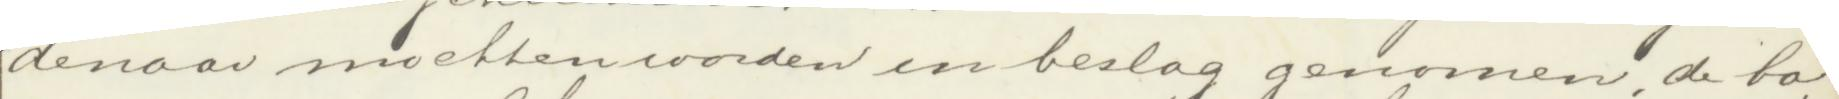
denaar mochten worden in beslag genomen, de bo.
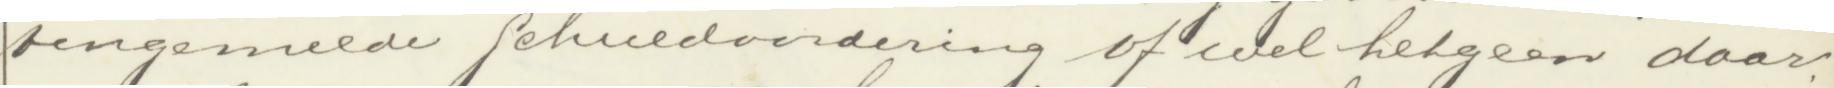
vengemelde schuldvordering of wel hetgeen daar„
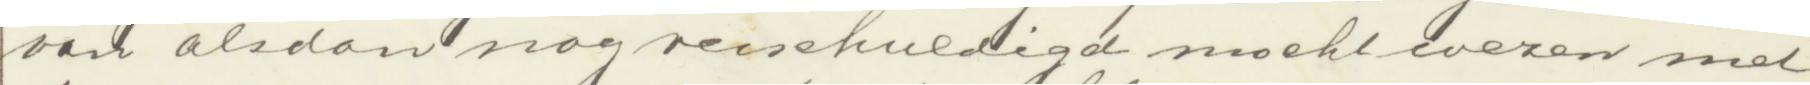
van alsdan nog verschuldigd mocht wezen met
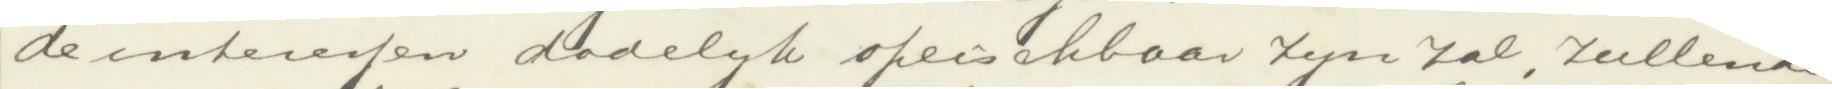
de interessen dadelyk opeischbaar zyn zal, zullende
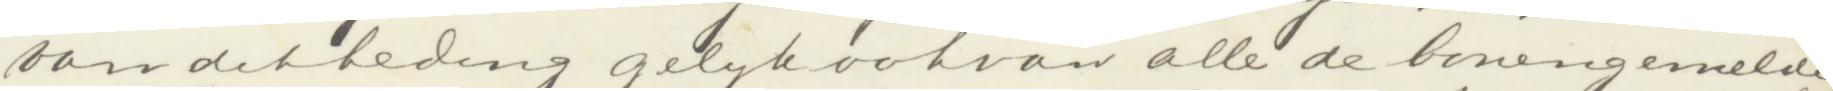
van ditbeding gelyk ook van alle de bovengemelde
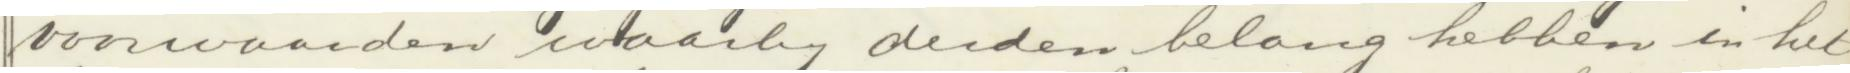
voorwaarden waarby derden belang hebben in het
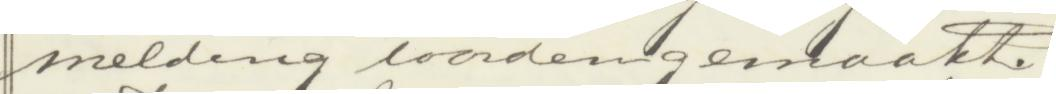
melding worden gemaakt.
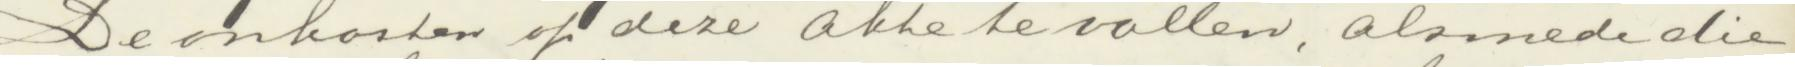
De onkosten op deze akte te vallen alsmede die
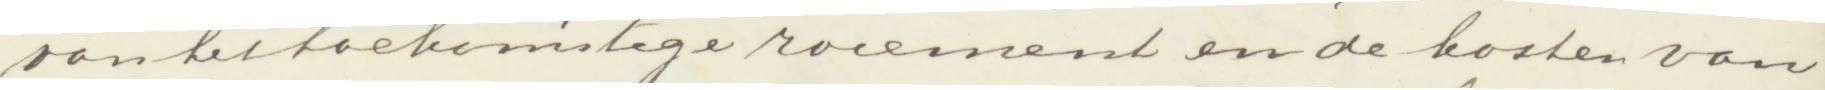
van het toekemstige roiement en de kosten van
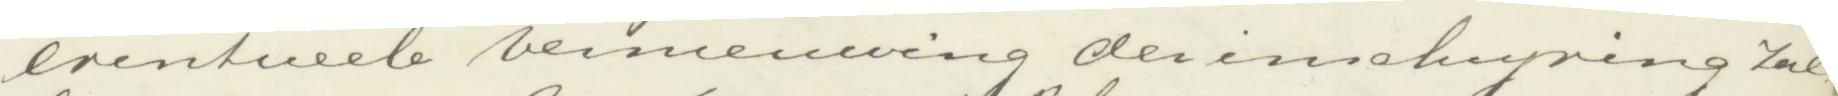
eventueele vernieuwing der inschryving zul
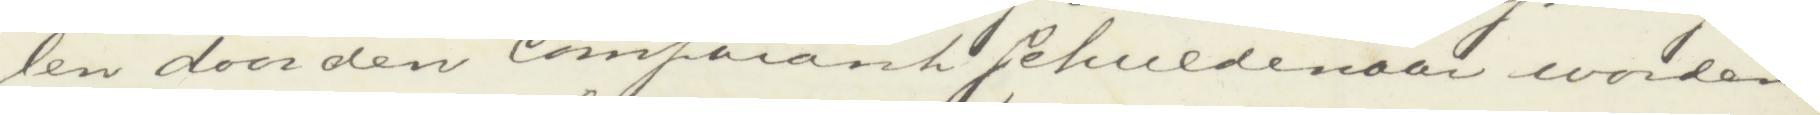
len door den Comparant schuldenaar worden
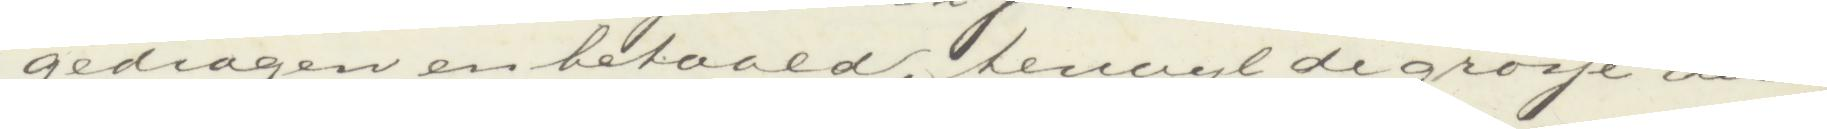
gedragen en betaald, tenwyl de grosse deze
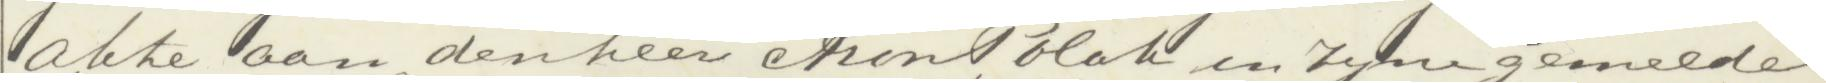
akte aan den heer Aron Polak, in zyne gemelde
